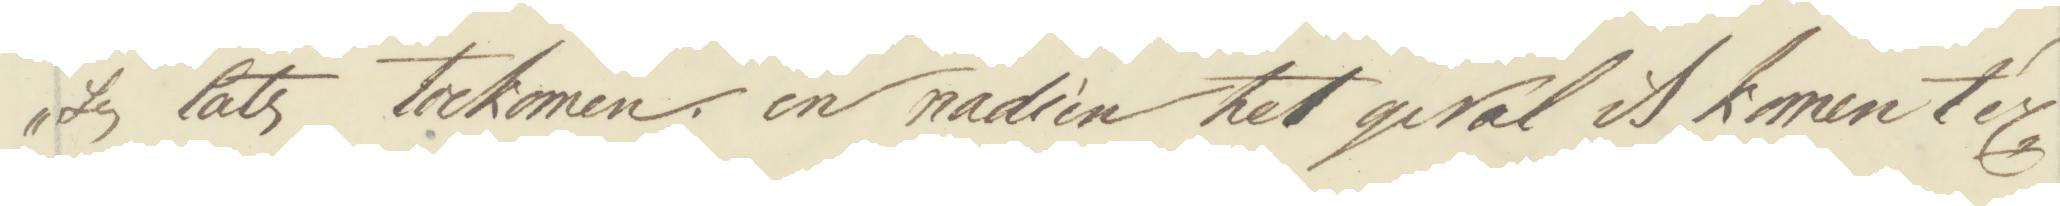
„sen laten toekomen; en nadien het geval is komen t'ex
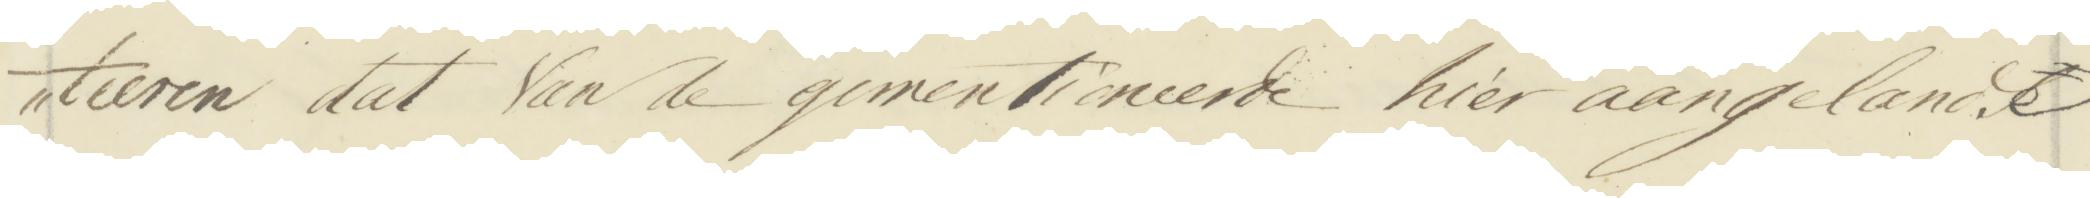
„teeren dat van de gementioneerde hier aangelande
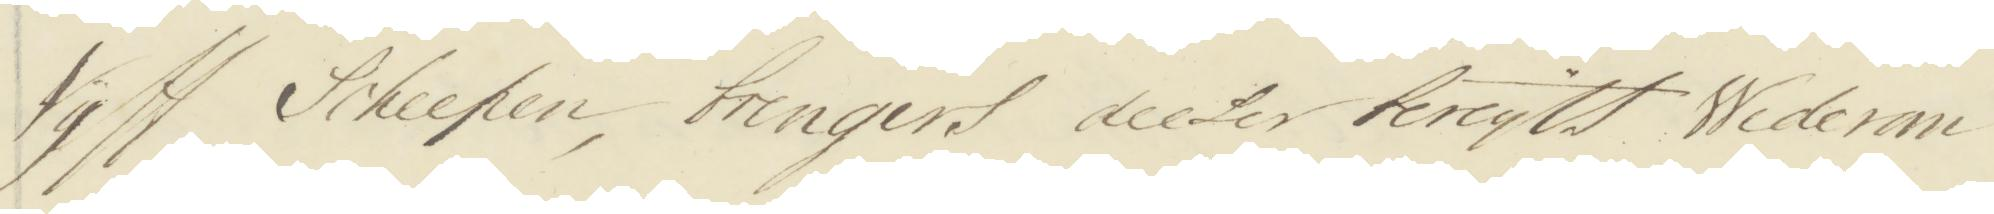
vijff scheepen, brengers deezer bereijts wederom
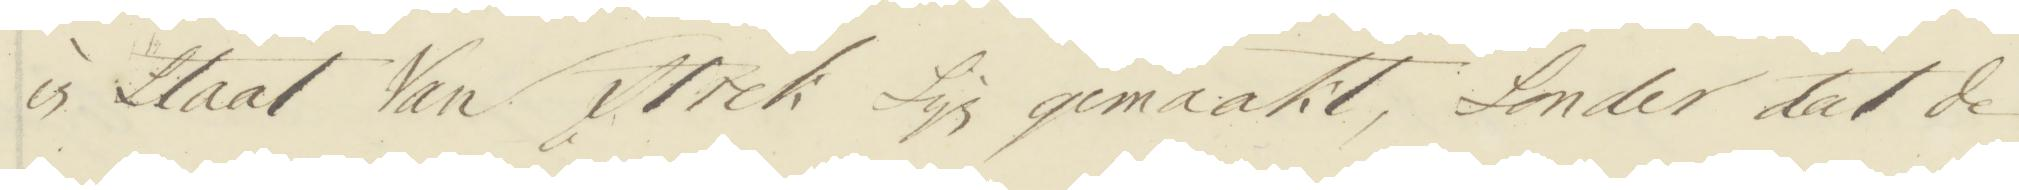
in staat van vertrek zijn gemaakt, sonder dat de
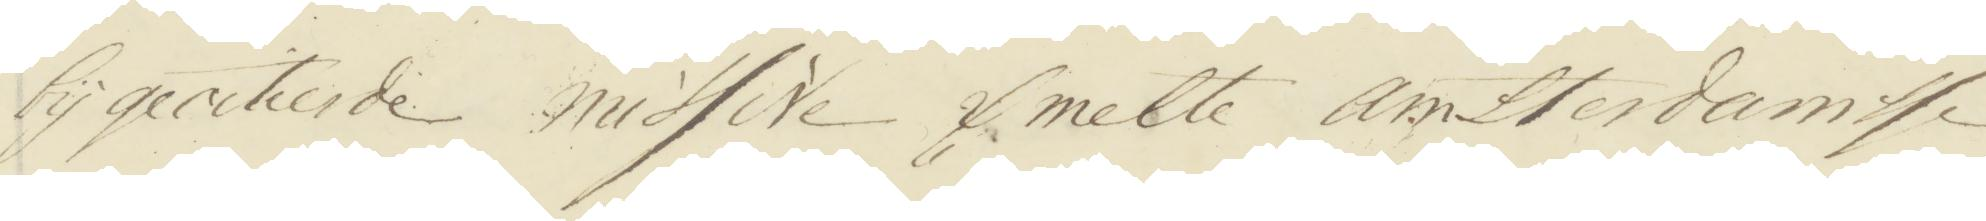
bij geciteerde missive vermelte amsterdamsse
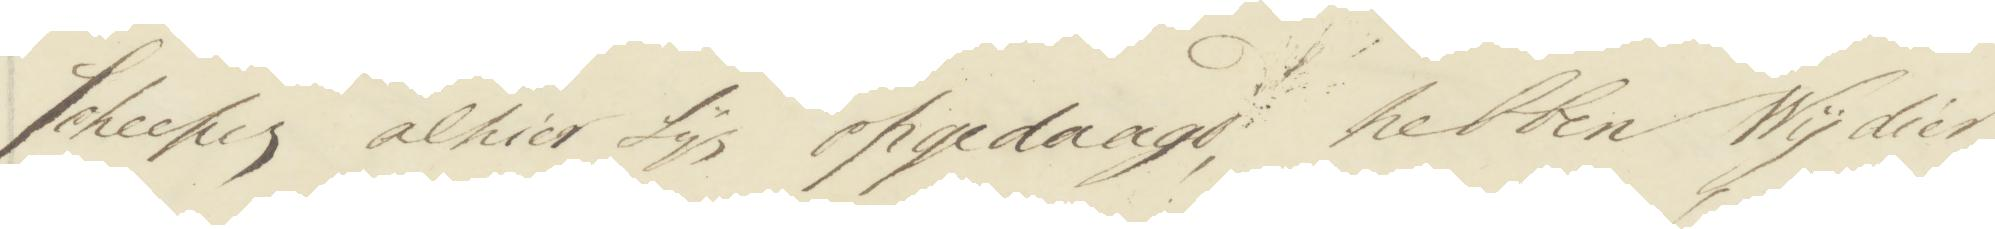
scheepen alhier sijn opgedaagd, hebben wij dier
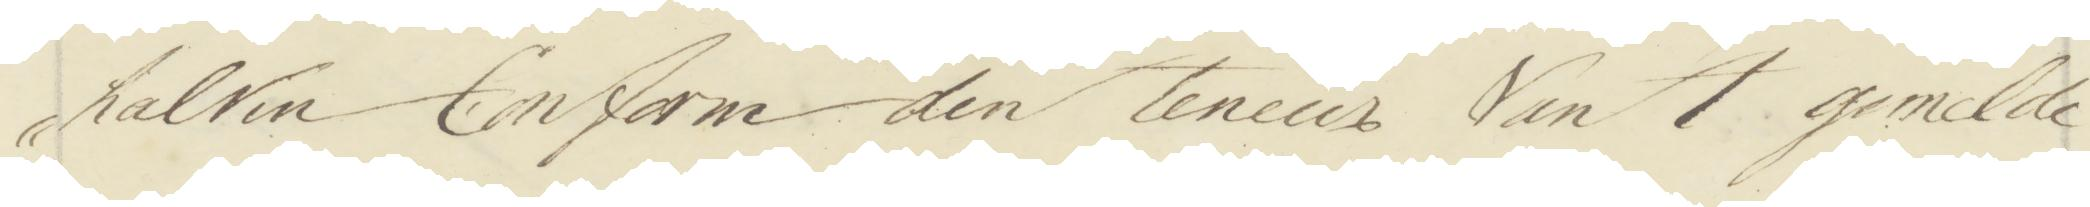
„halven Conform den teneur van ’t gemelde
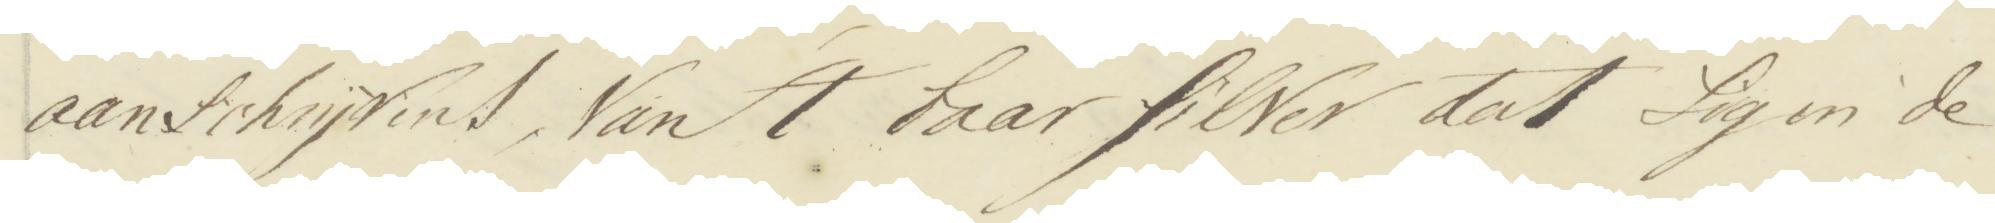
aanschrijvens, van ’t baar silver dat sig in de
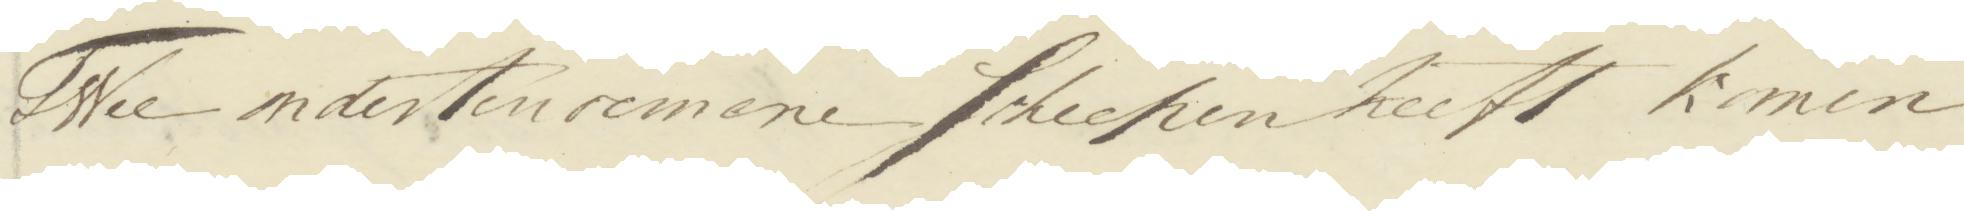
Twee ondertenoemene scheepen heeft komen
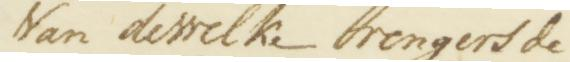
van dewelke brengers de
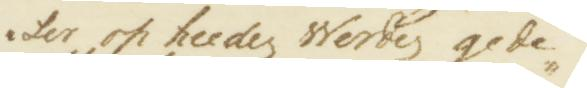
„ser op heeden werden gede„
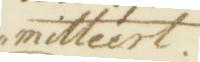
„mitteert.
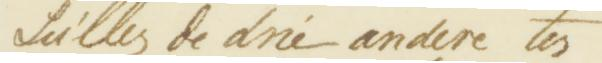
sullen de drie andere ten
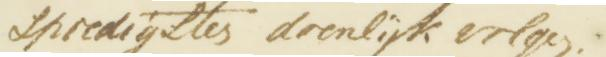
spoedigsten doenlijk volgen:
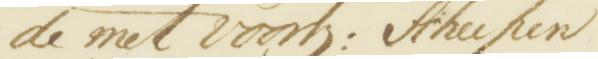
de met voorsz: scheepen
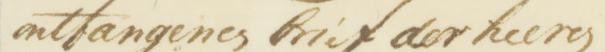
ontfangenen brief der heeren
